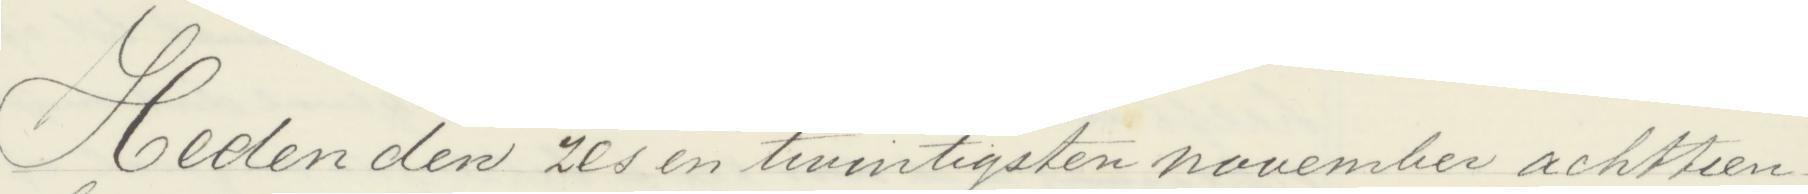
Heden den zes en twintigsten november achttien
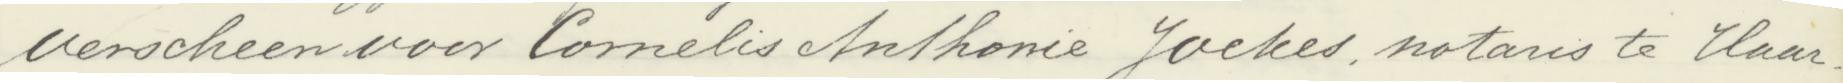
verscheen voor Cornelis Anthonie Joekes, notaris te Haar
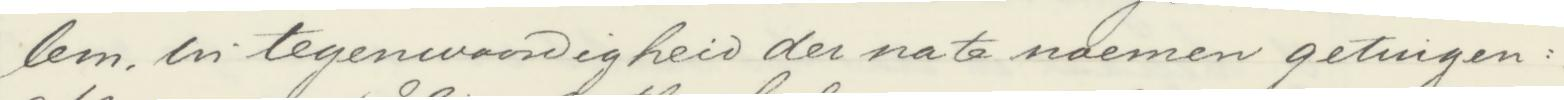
lem, in tegenwoordigheid der na te noemen getuigen:
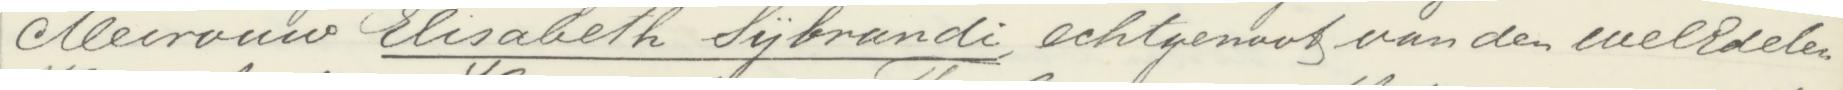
Mevrouw Elisabeth Sijbrandi, echtgenoot van den welEdelen
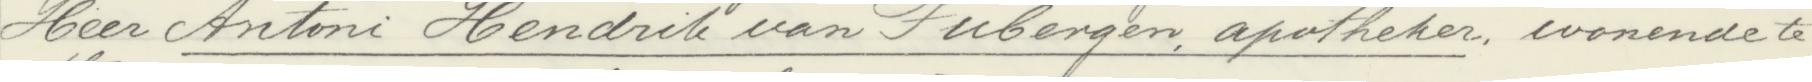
Heer Antoni Hendrik van Tubergen, apotheker, wonende te
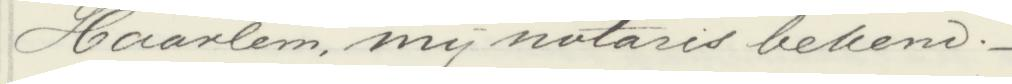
Haarlem, mij notaris bekend.
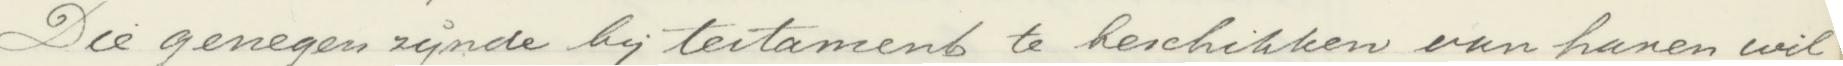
Die genegen zijnde bij testament te beschikken van haren wil
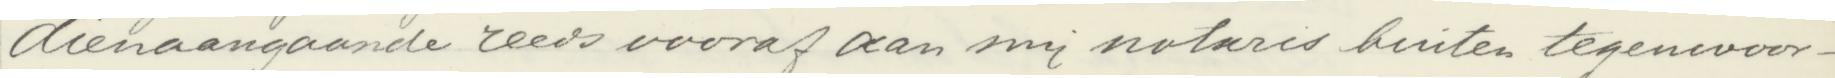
dienaangaande reeds vooraf aan mij notaris buiten tegenwoor
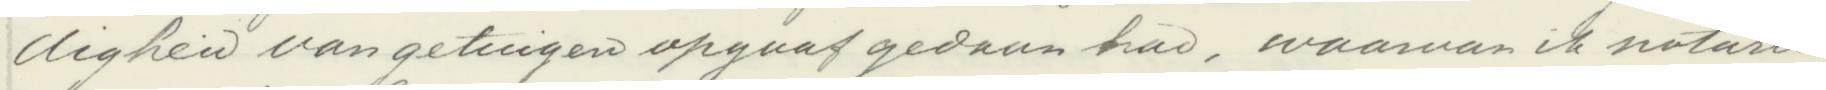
digheid van getuigen opgaaf gedaan had, waarvan ik notaris
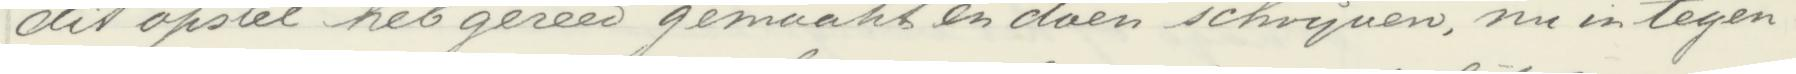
dit opstel heb gereed gemaakt en doen schrijven, nu in tegen
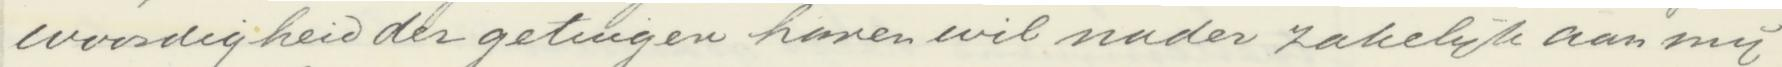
woordigheid der getuigen haren wil nader zakelijk aan mij
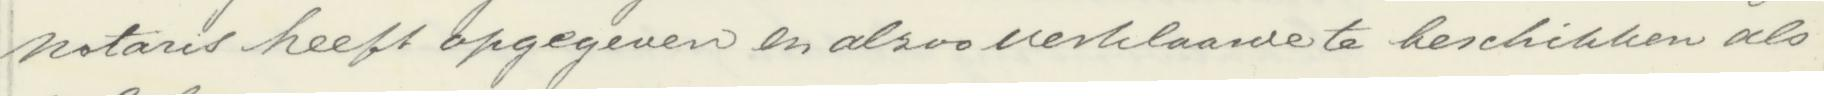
notaris heeft opgegeven en alzoo verklaarde te beschikken als
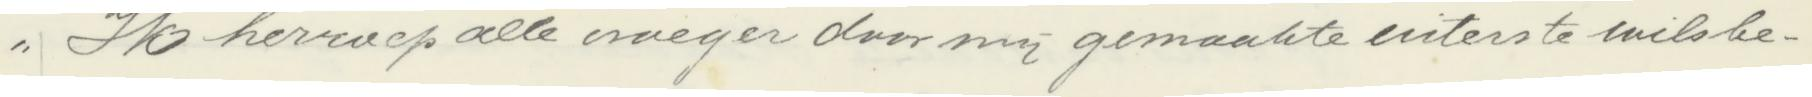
„ Ik herroep alle vroeger door mij gemaakte uiterste wils be-
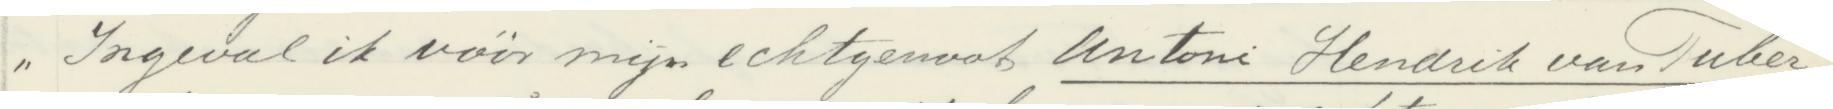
„ Ingeval ik vóór mijn echtgenoot Antoni Hendrik van Tuber
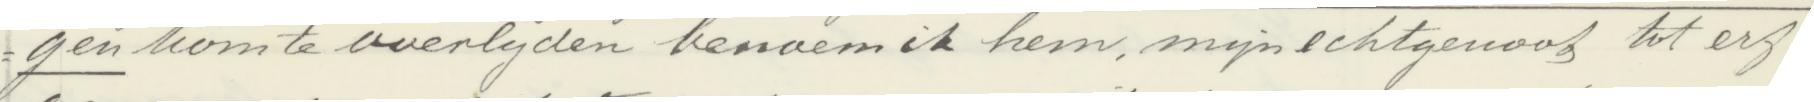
„ gen kom te overlijden benoem ik hem, mijn echtgenoot tot erf-
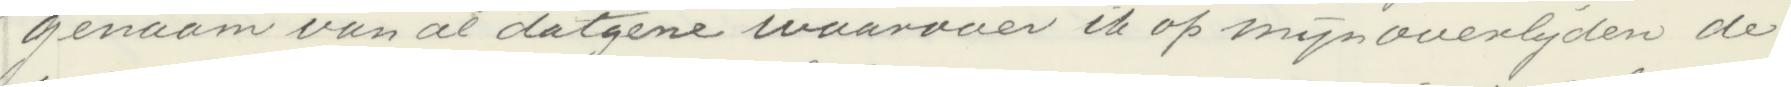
genaam van al datgene waarvoor ik op mijn overlijden de
